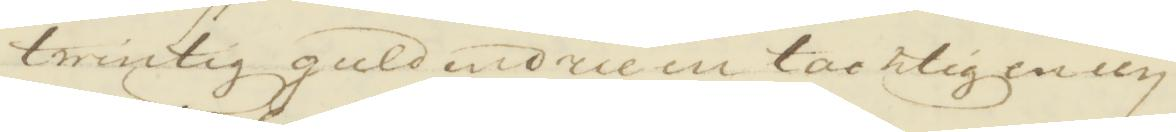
twintig gulden drie en tachtig en een
